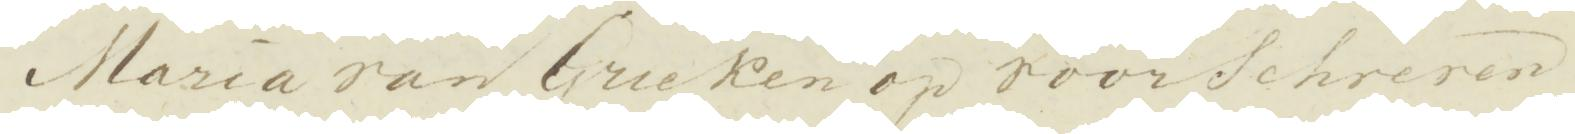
Maria van Grieken op voorschreven
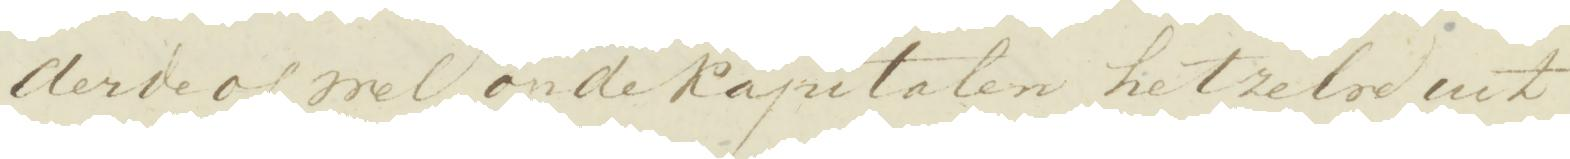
derde of wel op de kapitalen hetzelve uit
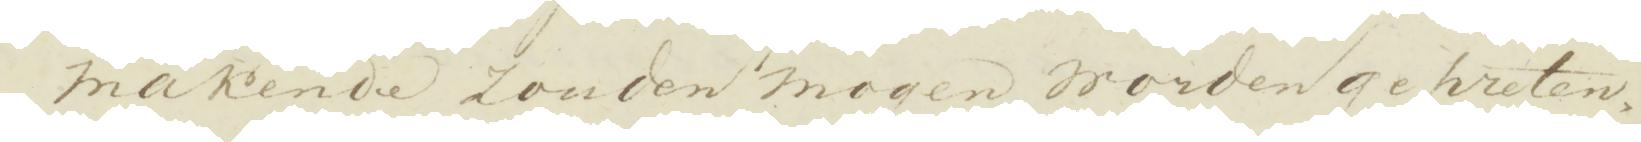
makende zouden mogen worden gepreten„
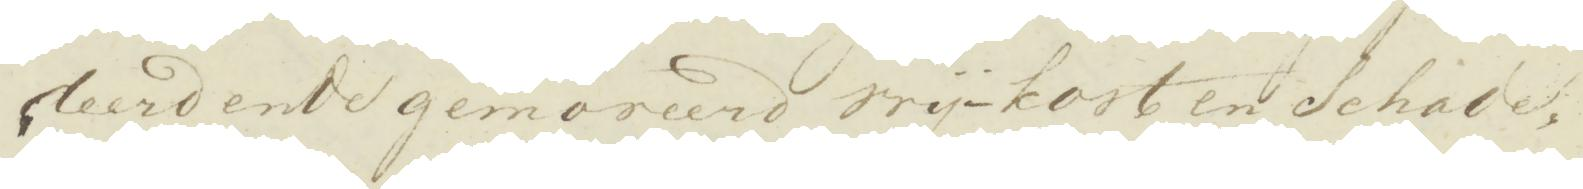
deerd ende gemoveerd vrij-kost en schade„
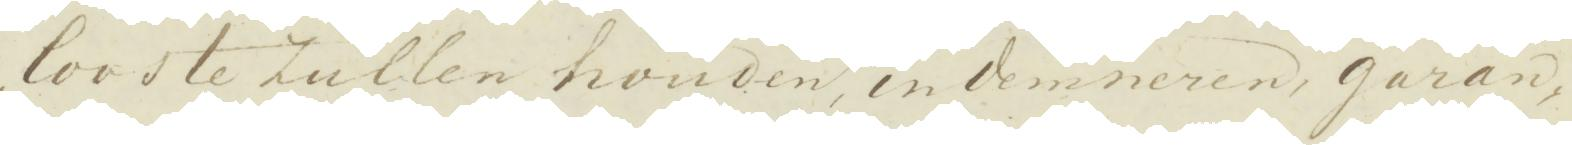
loos te zullen houden, in demneren, garan„
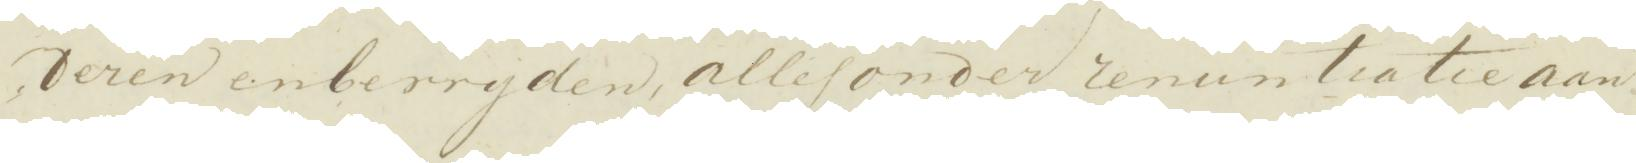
„deren en bevrijden, alles onder renuntiatie aan
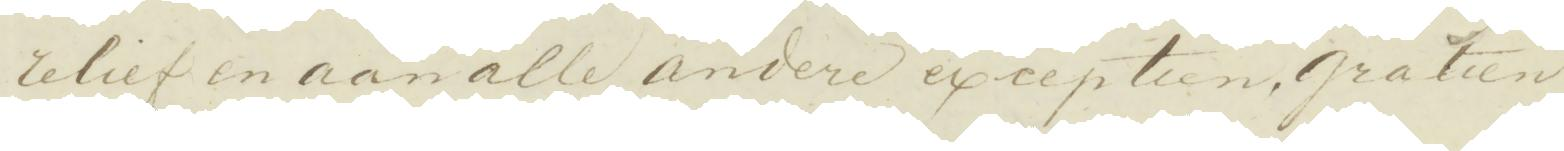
relief en aan alle andere exceptien, gratien
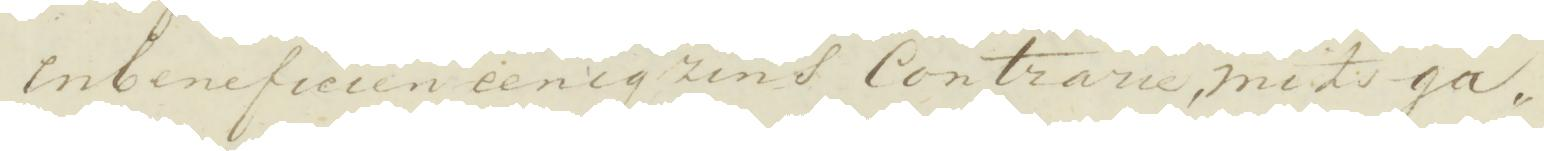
en beneficien eenigzins Contrarie, mitsga„
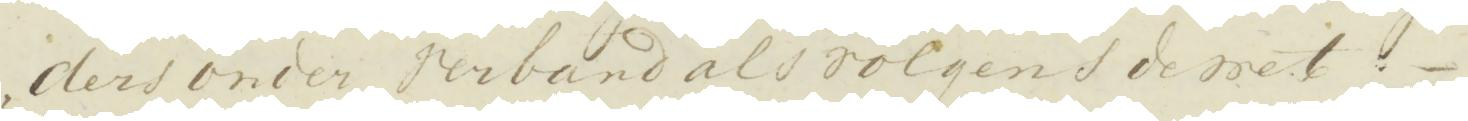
,ders onder verband als volgens de wet. —
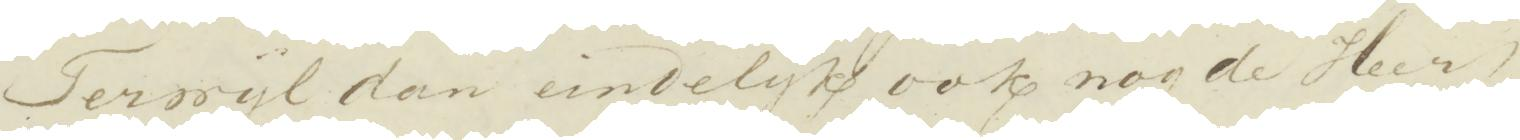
Terwijl dan eindelijk ook nog de Heer
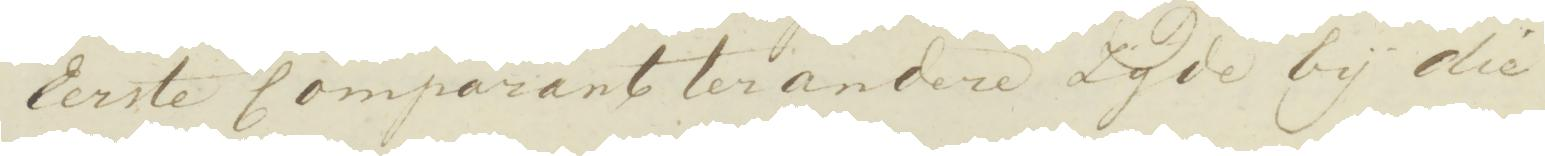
Eerste Comparant ter andere zijde bij die
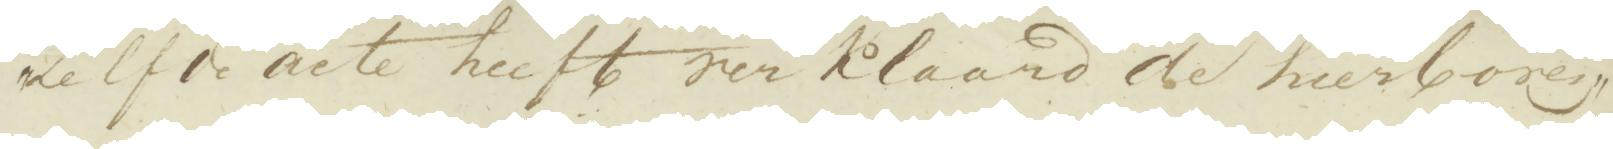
zelfde acte heeft verklaard de hierboven„
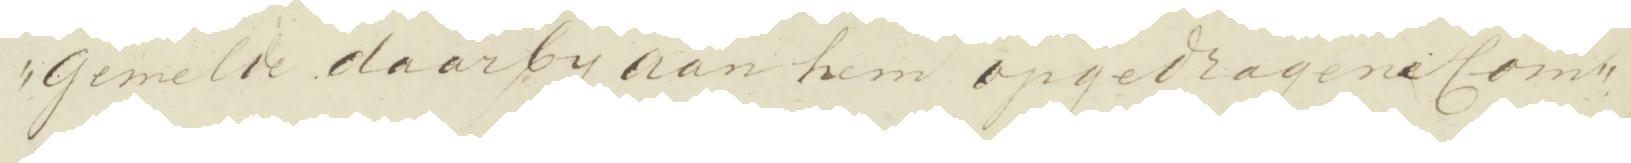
„gemelde daarbij aan hem opgedragene Com„
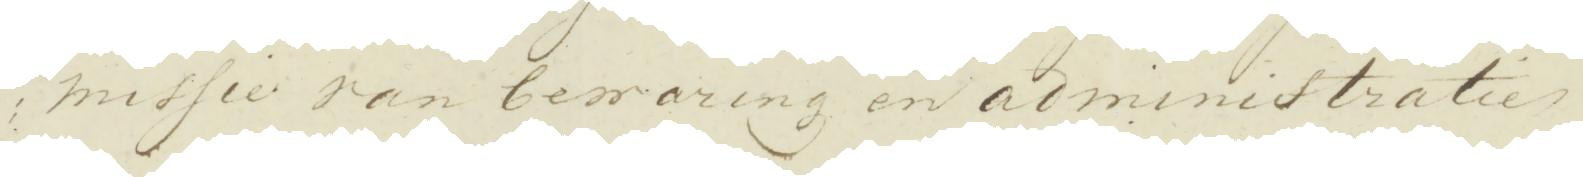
„missie van bewaring en administratie
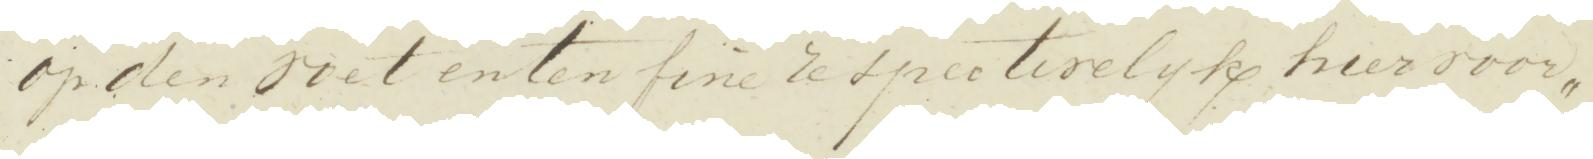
op den voet en ten fine respectivelyk hier voor„
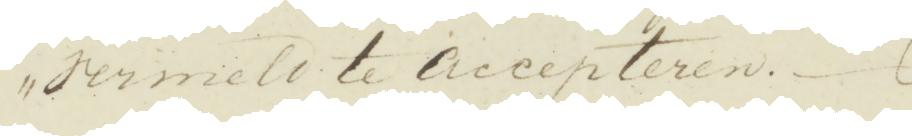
„vermeld te accepteren. —
